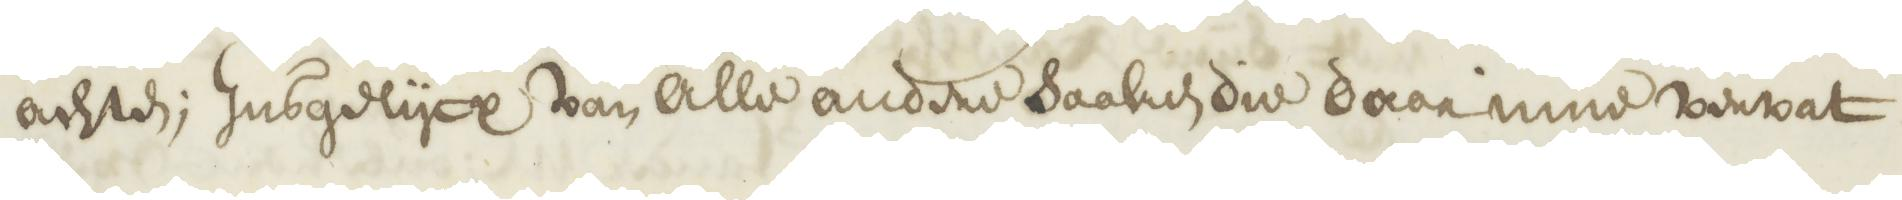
achten; Jnsgelijcx van alle andere saaken die daar inne vervat
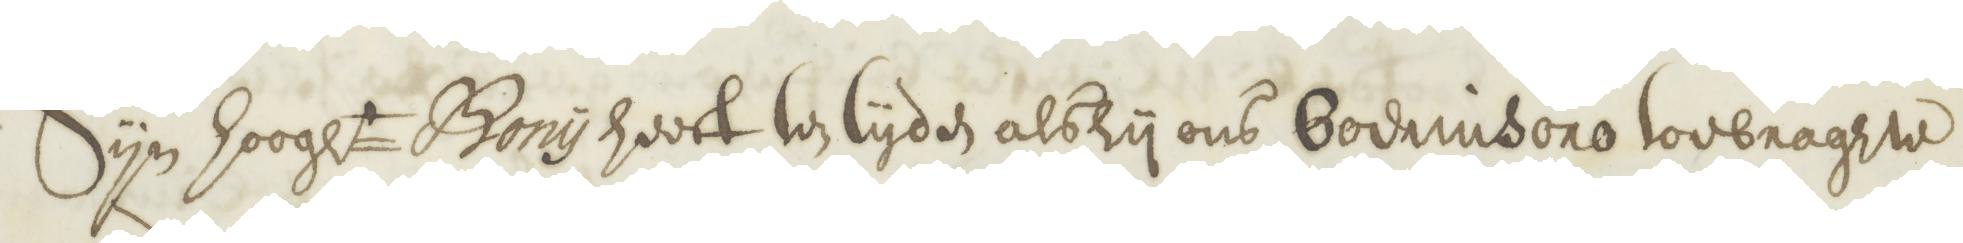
Sijn hoogh=t Bonij heeft ten tijden als hij ons boemisoro toebraghte
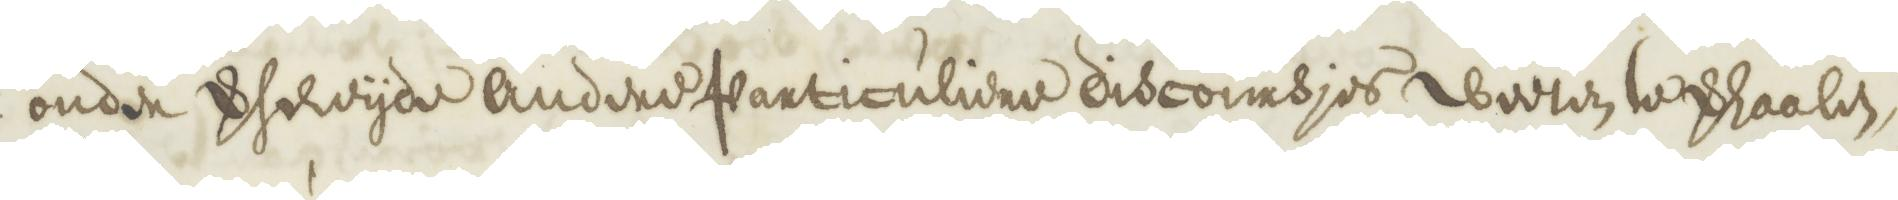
onder verscheijde andere particuliere discoursjes weeten te verhaalen,
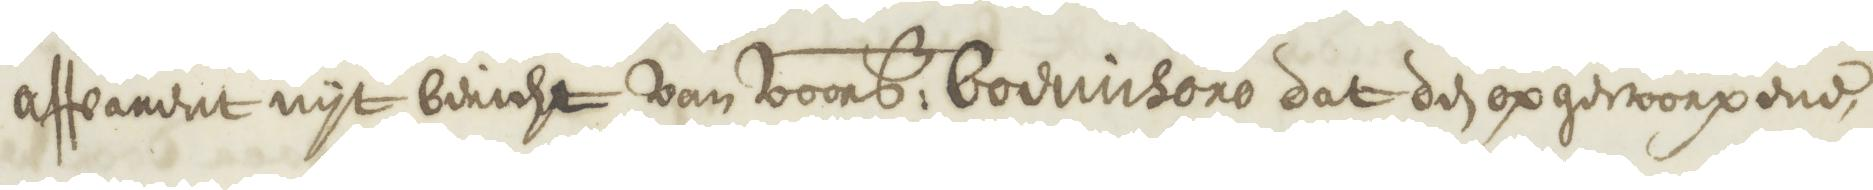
apparent uijt bericht van voors:z boemisoro dat den opgeworpene,
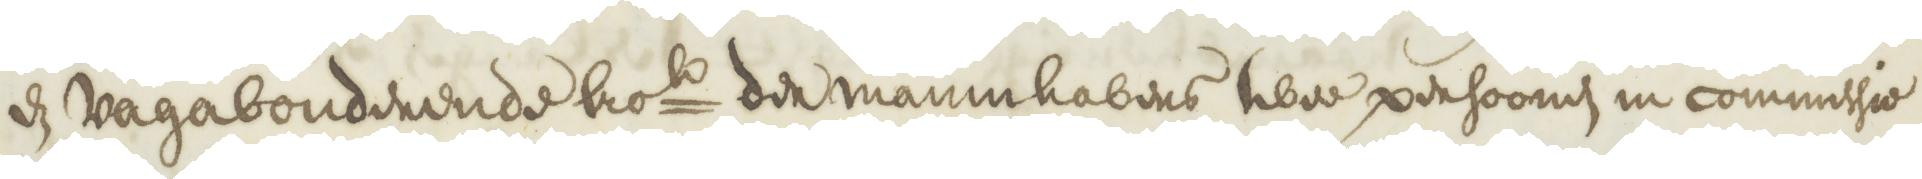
en vagabonderende ko=k der maninkabers twee persoonen in commissie
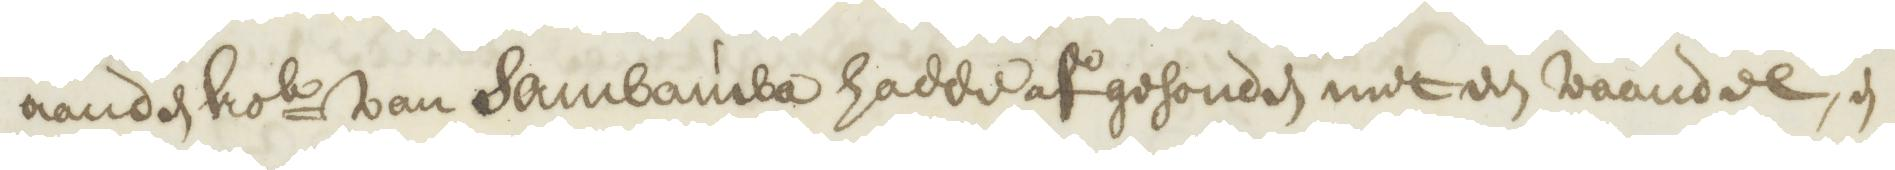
aan den ko=k van Sambauwa hadde afgesonden met een vaandel, en
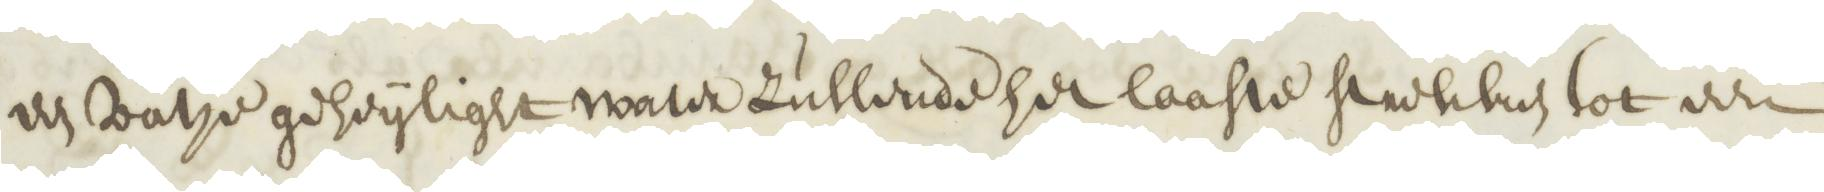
een vatje geheijlight water zullende het laaste strekken tot een
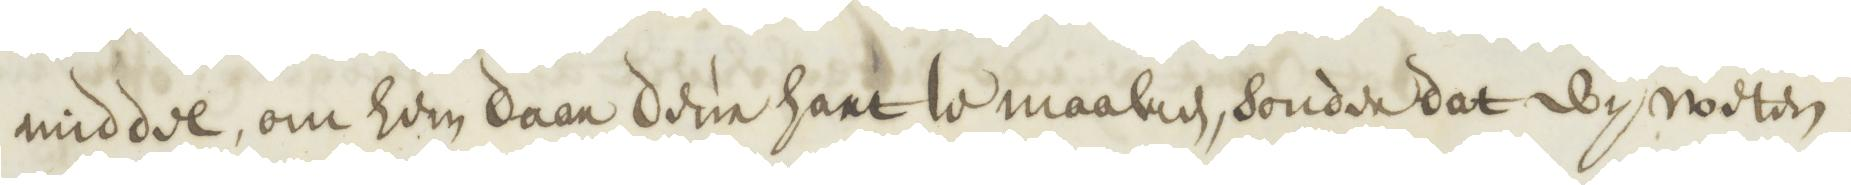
middel, om hem daar deur hart te maaken, sonder dat wy weten
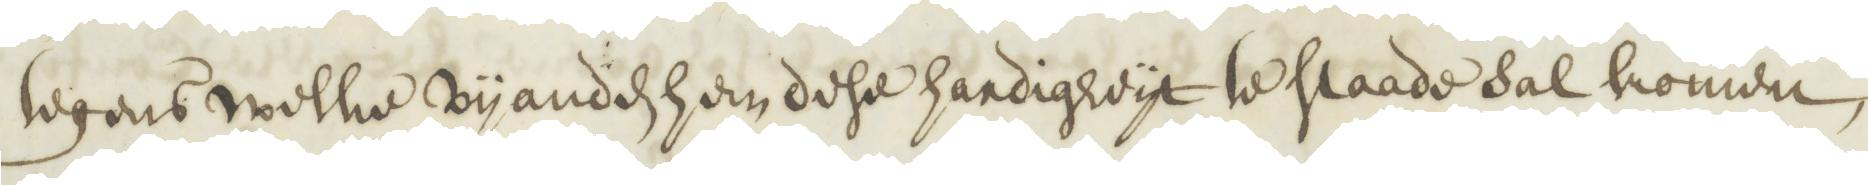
tegens welke vijanden hem dese hardigheijt te staade sal komen
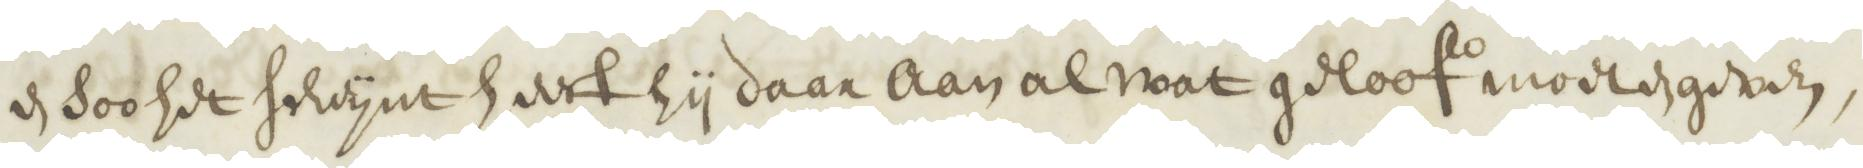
en soo het scheijnt heeft hij daar aan al wat geloof moeten geven,
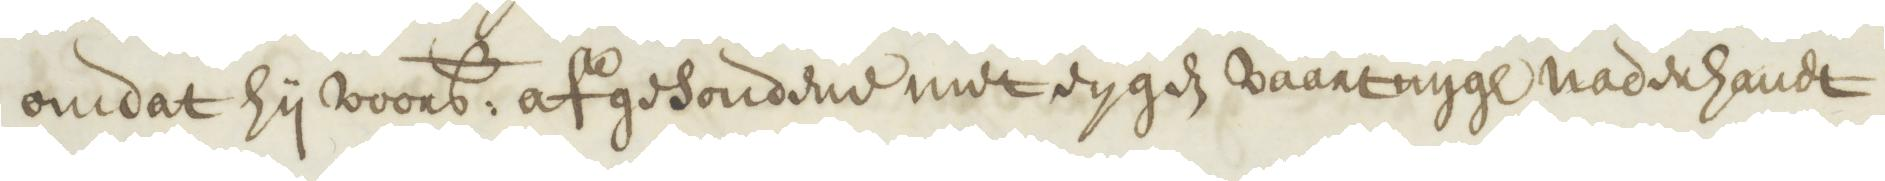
omdat hij voors:z afgesondene met eijgen vaartuijgh naderhandt
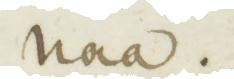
naa.
